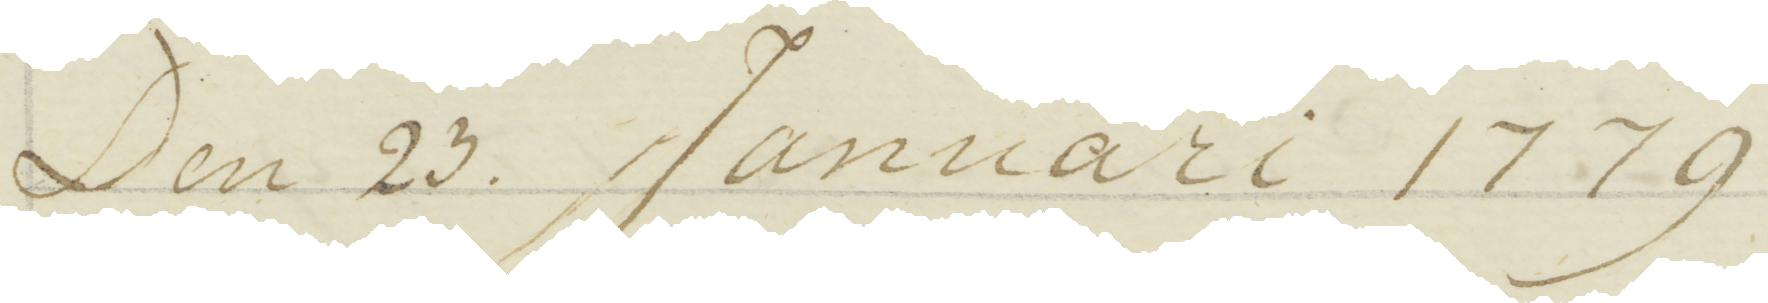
Den 23. Januari 1779
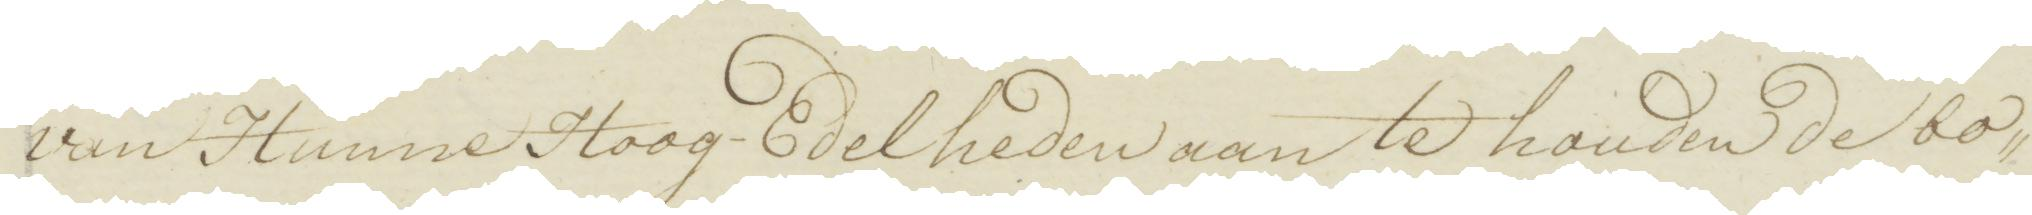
van Hunne Hoog Edelheden aan te houden de bo„
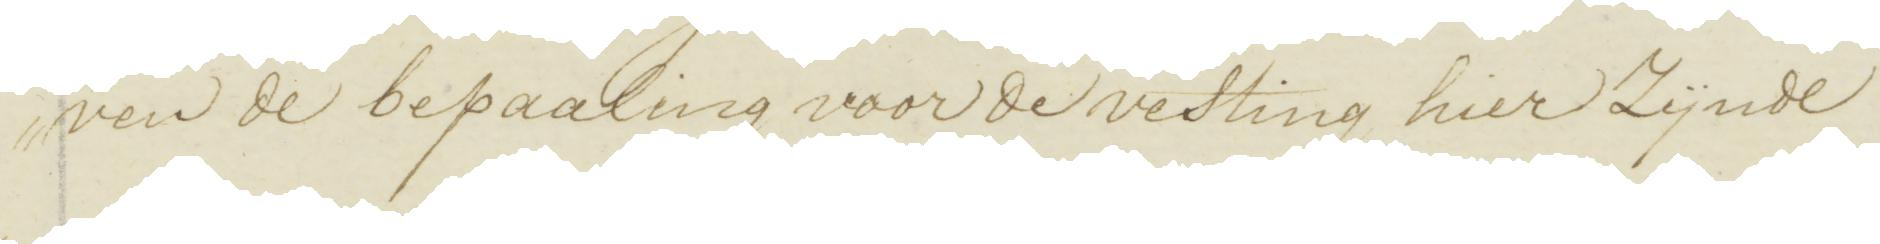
„ven de bepaaling voor de vesting hier zijnde
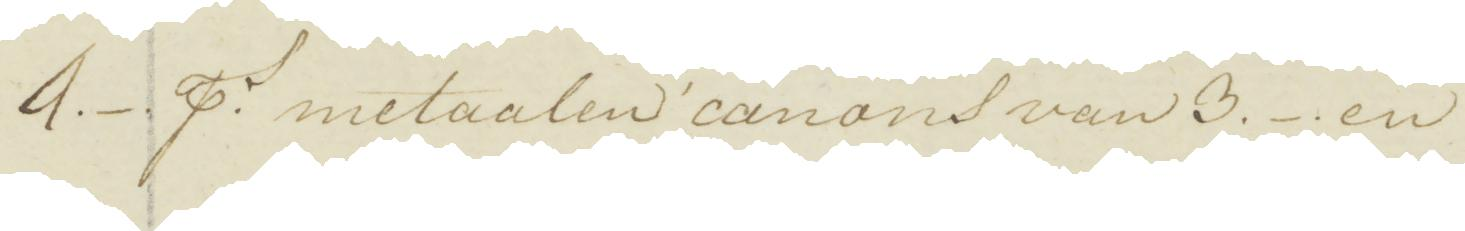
4.– p.s metaalen canons van 3.–. en
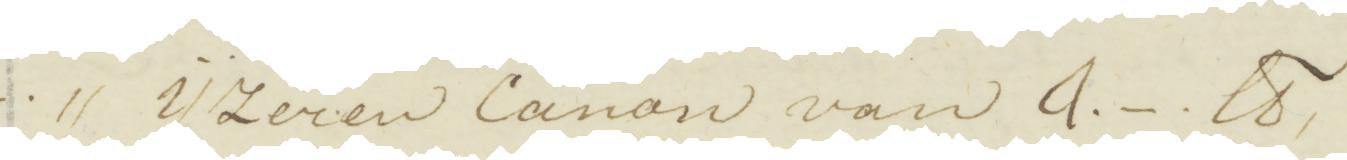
:11 ijzeren canon van 4.-. lb,
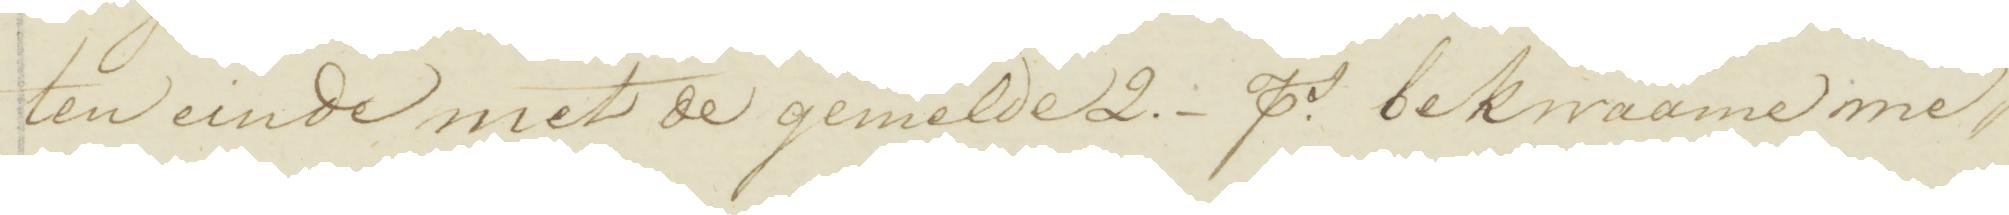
ten einde met de gemelde 2.– p.s bekwaame me
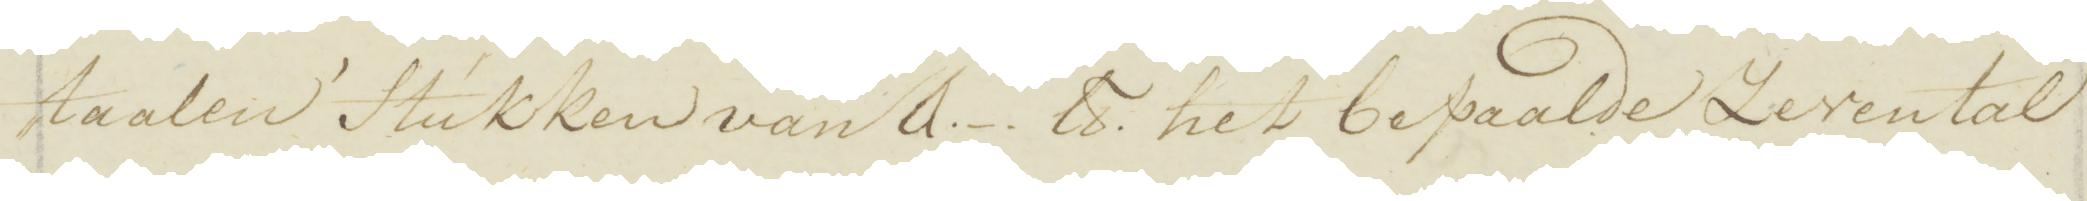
taalen stukken van 4.–. lb: het bepaalde zevental
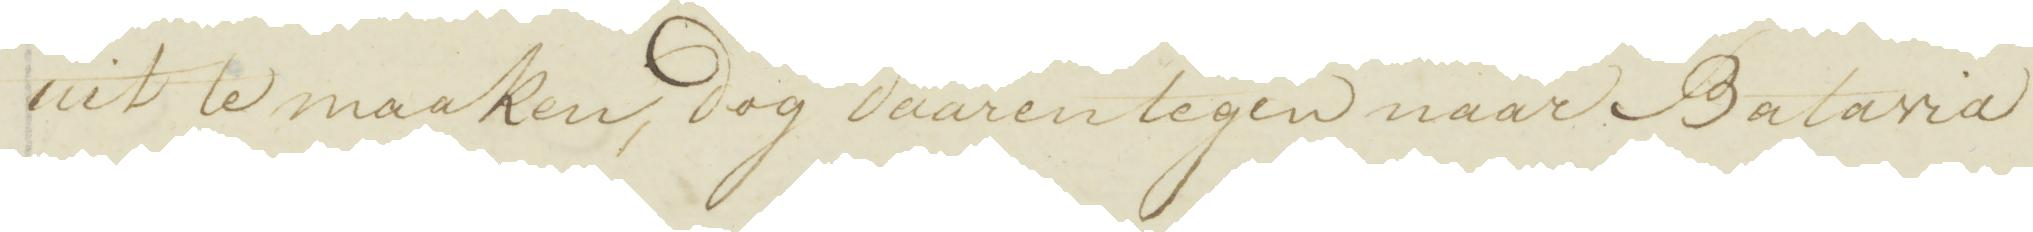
uit te maaken, dog daarentegen naar Batavia
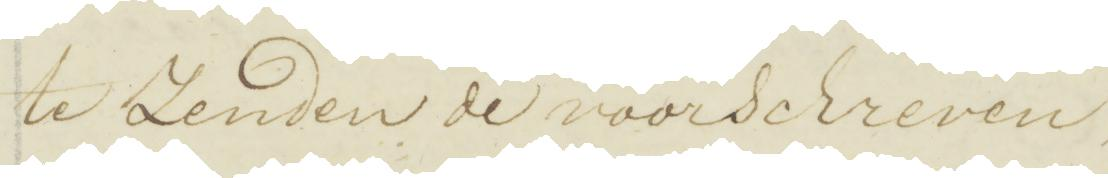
te zenden de voorschreven
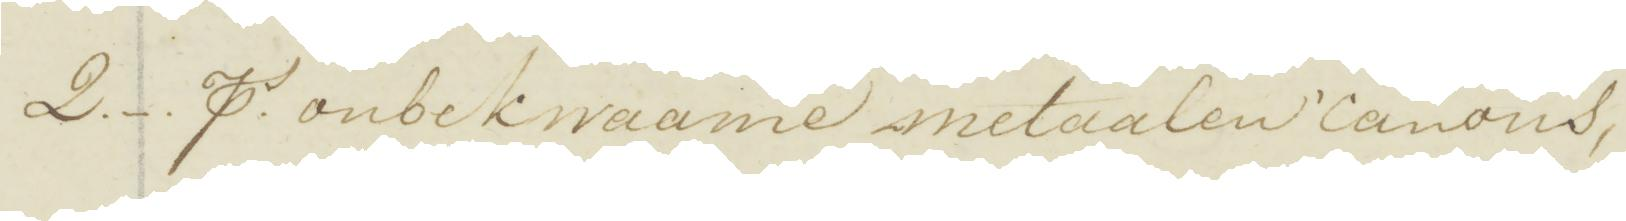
2.–. p.s onbekwaame metaalen canons,
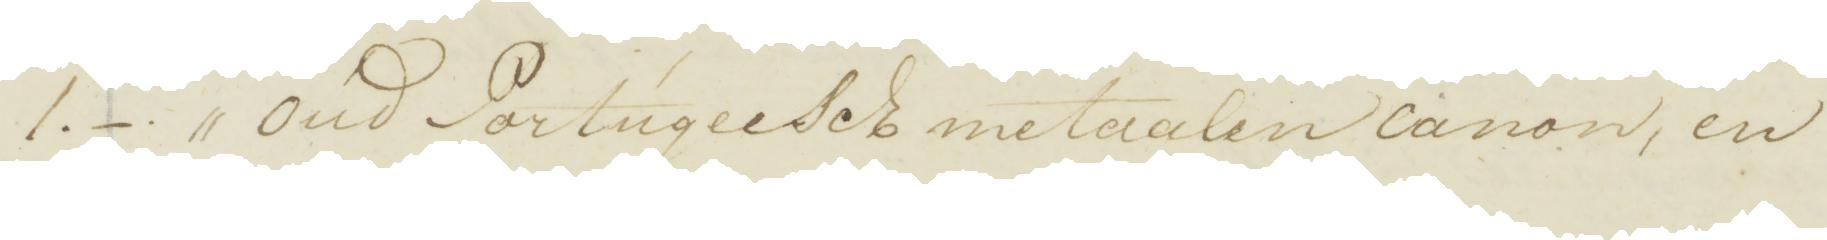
1.–. „ oud Portugeesch metaalen canon, en
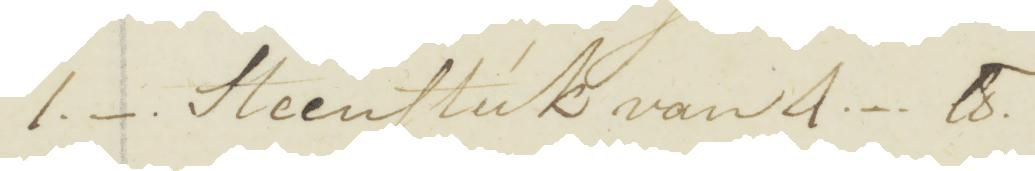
1.–. steenstuk van4.–. lb.
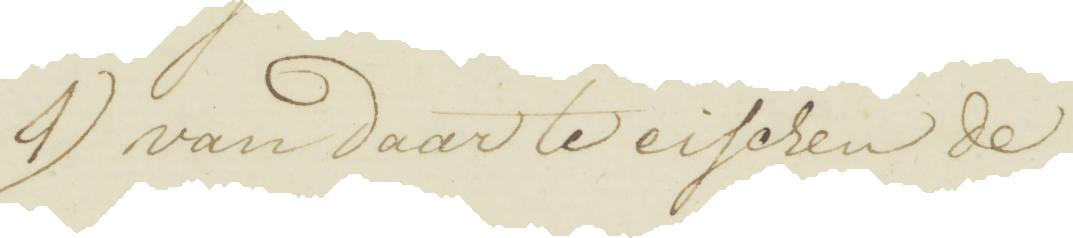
4) van daar te eischen de
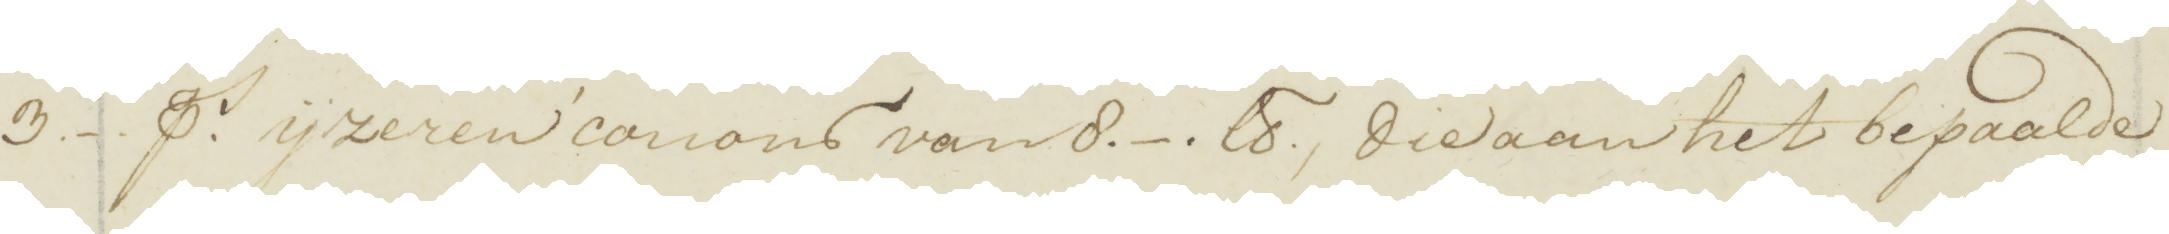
3.– p.s ijzeren canons van 8.–. lb., die aan het bepaalde
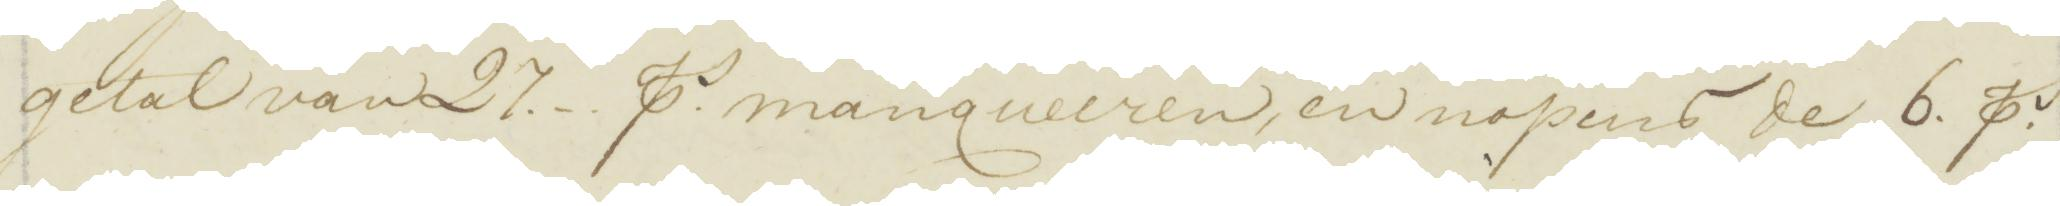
getal van 27.–. p.s manqueeren, en nopens de 6. p.s
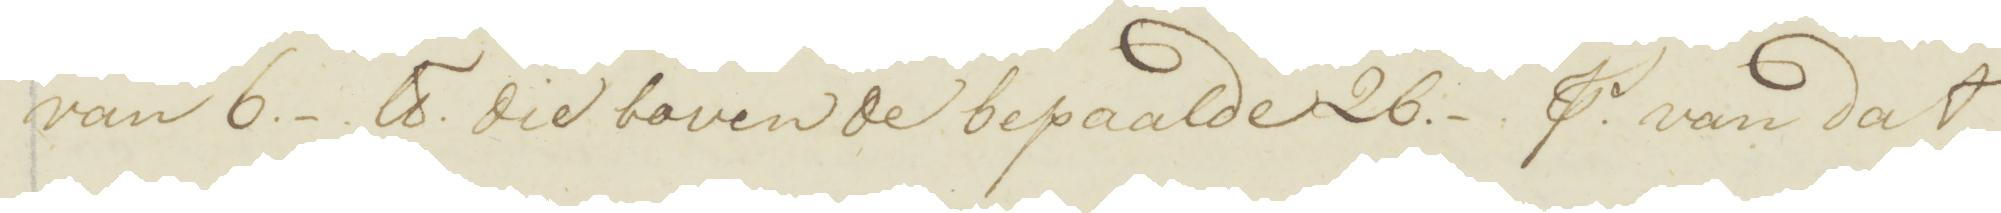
van 6.–. lb. die boven de bepaalde 26:-: p:s van dat
